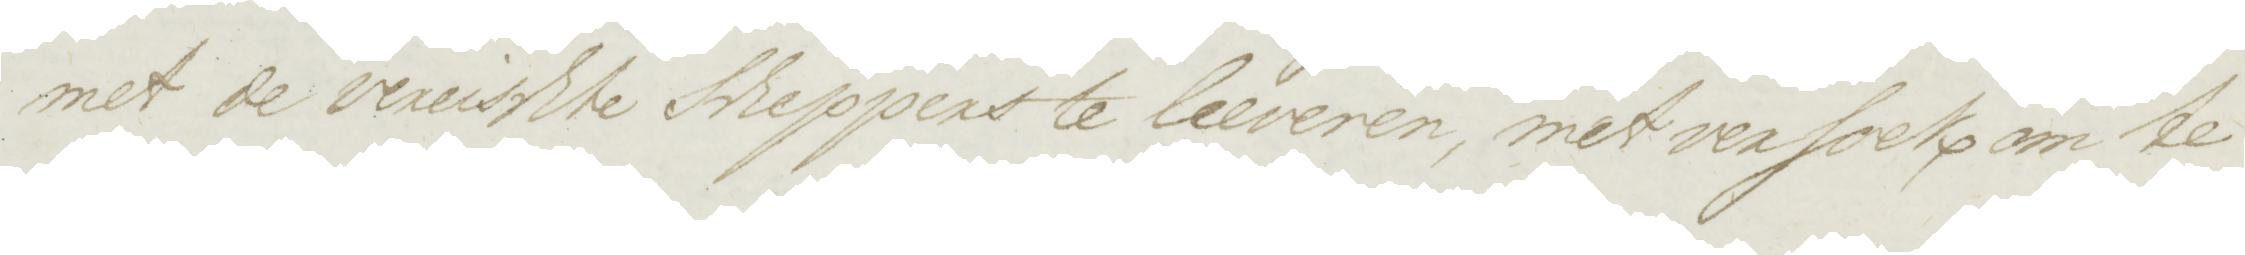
met de vereischte scheppers te leeveren, met versoek om te
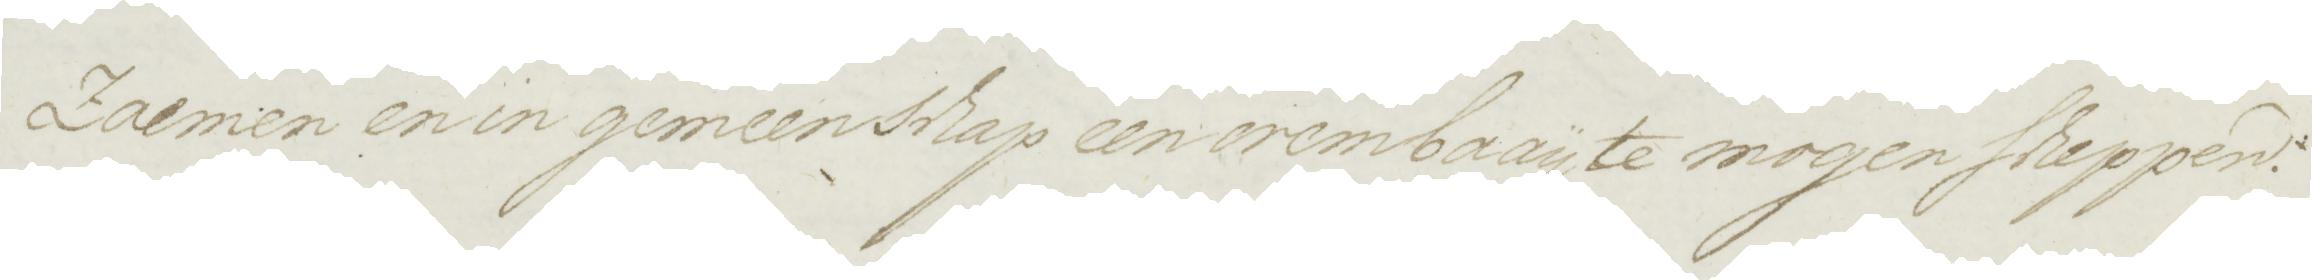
Zaemen en in gemeenschap een orembaaij te mogen scheppen.
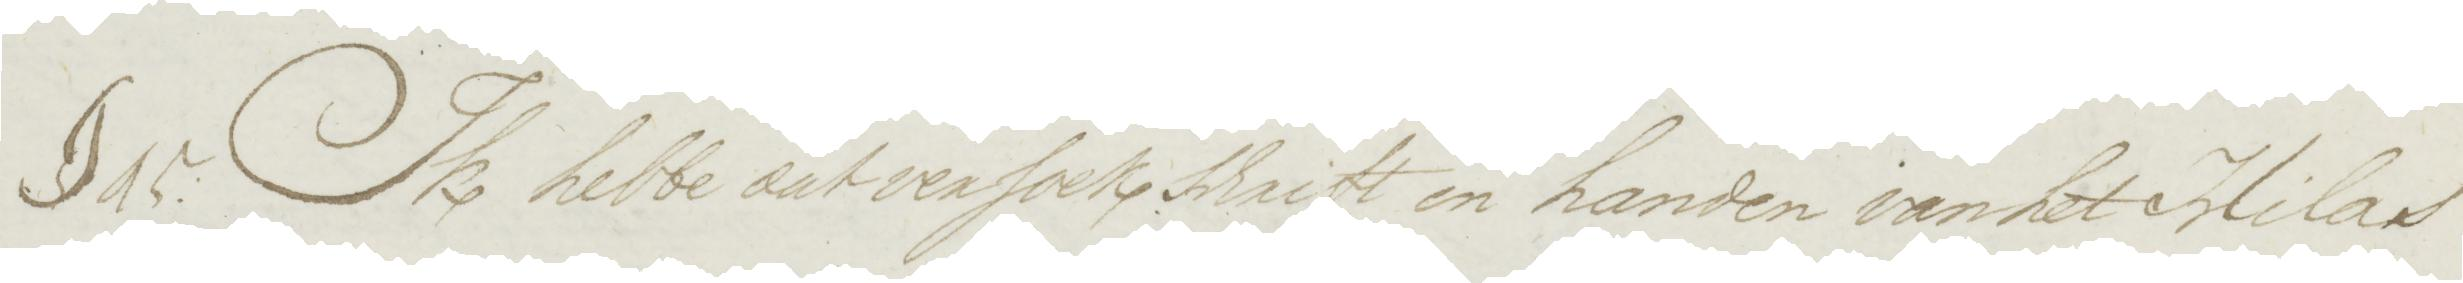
§ 45: Ik hebbe dat versoek schrift in handen van het Hilas
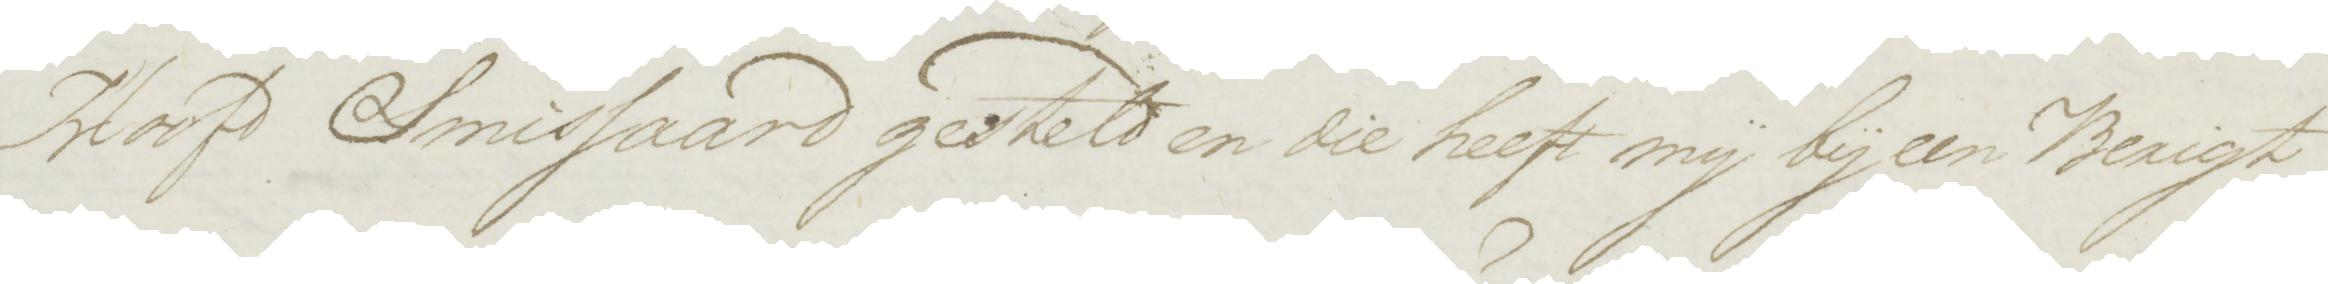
Hoofd Smissaard gesteld en die heeft mij bij een Berigt
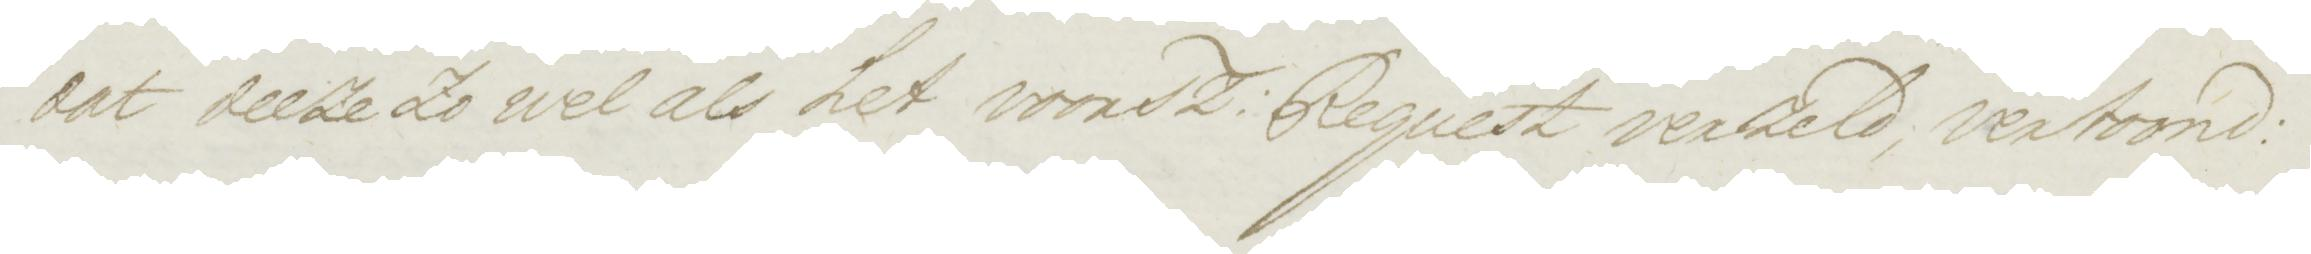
dat deeze zo wel als het voorsz: Request verzeld, vertoond:
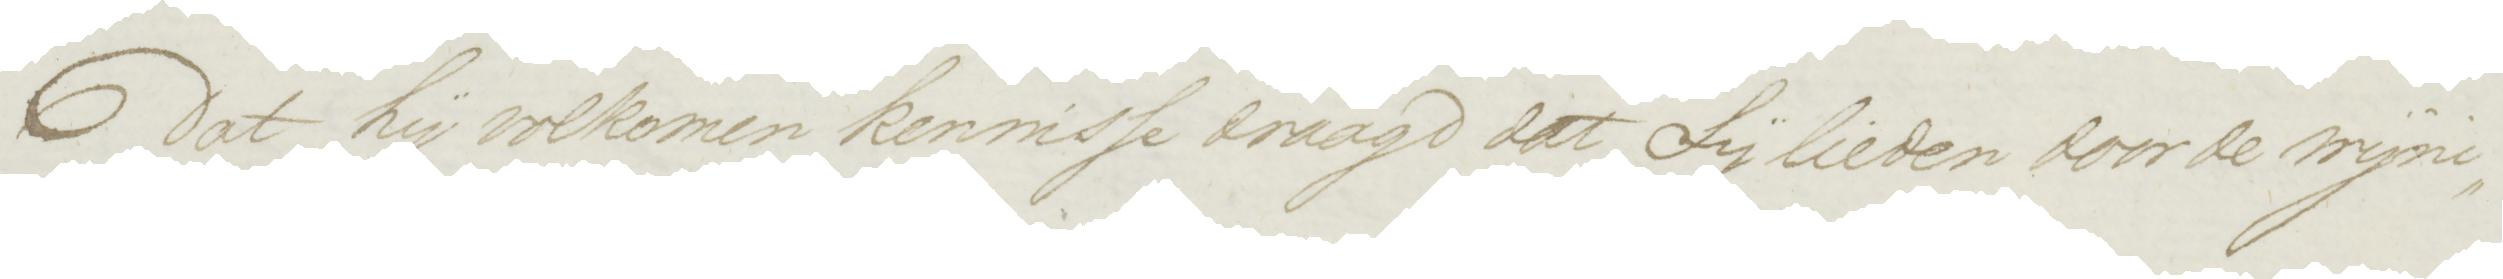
dat hij volkomen kennisse draagd dat sij lieden door de wijni„
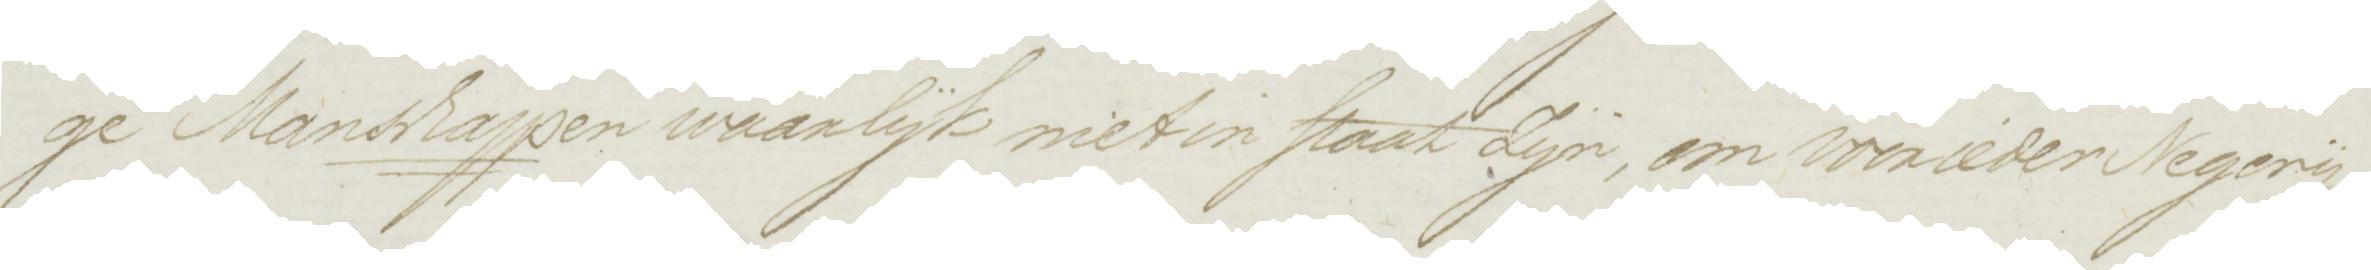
ge Manschappen waarlijk niet in staat zijn, om voor ieder Negorij,
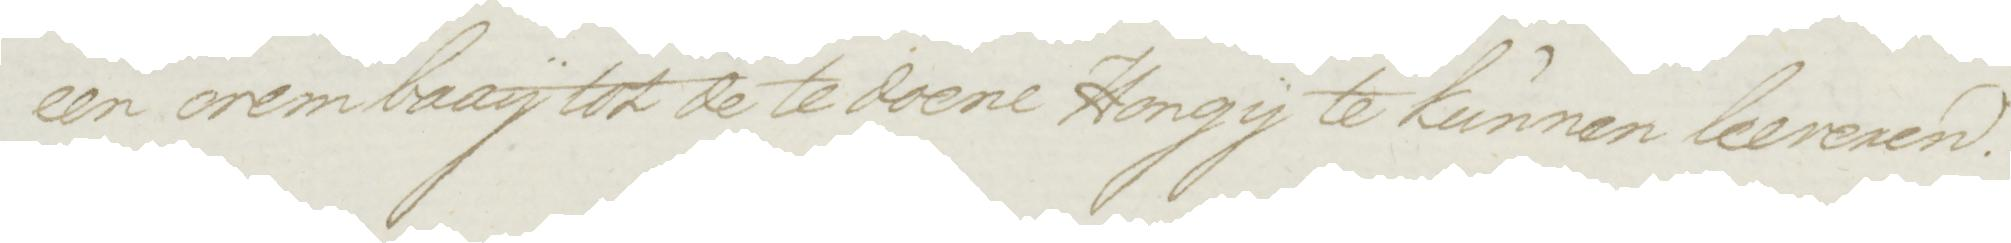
een orembaaij tot de te doene Hongij te kunnen leeveren.
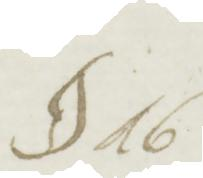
§ 46
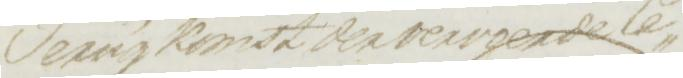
Terug komst der vervoerde Ce„
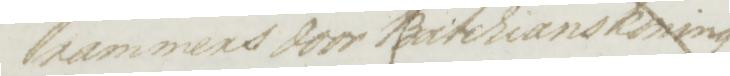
rammers door Batchians koning
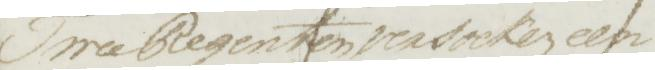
Twee Regenten versoeken een
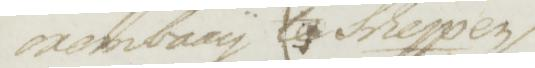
orembaaij te scheppen
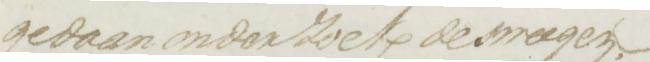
gedaan onderzoek desweegen.
